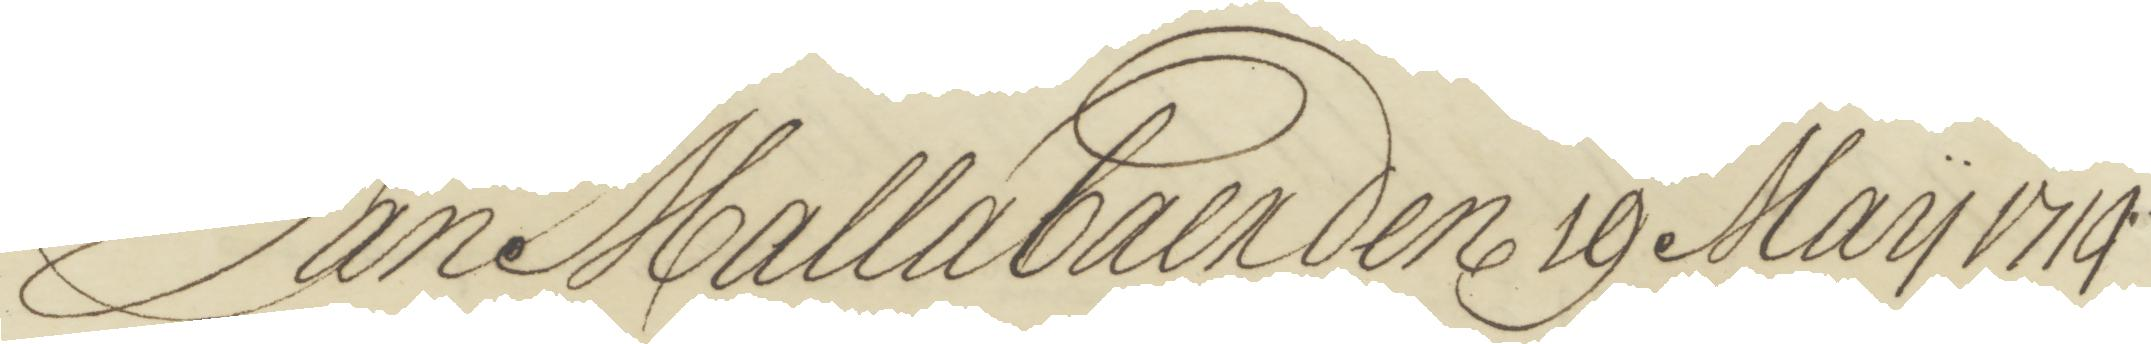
Van Mallabaer den 19 Maij 1714
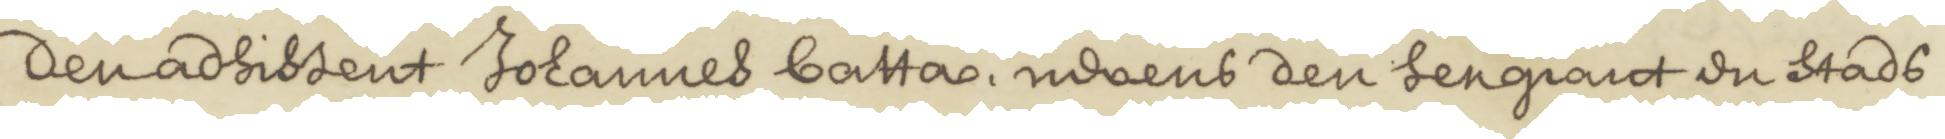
den adsistent Johannes batta, nevens den sergiant en stads
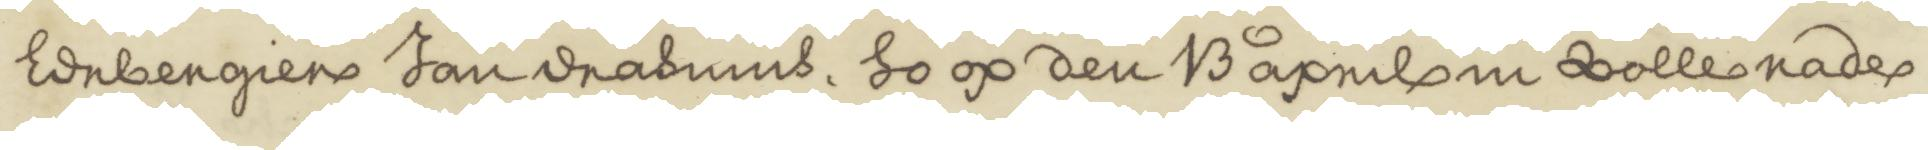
herbergier Jan erasmus, so op den 13' april in volle rade
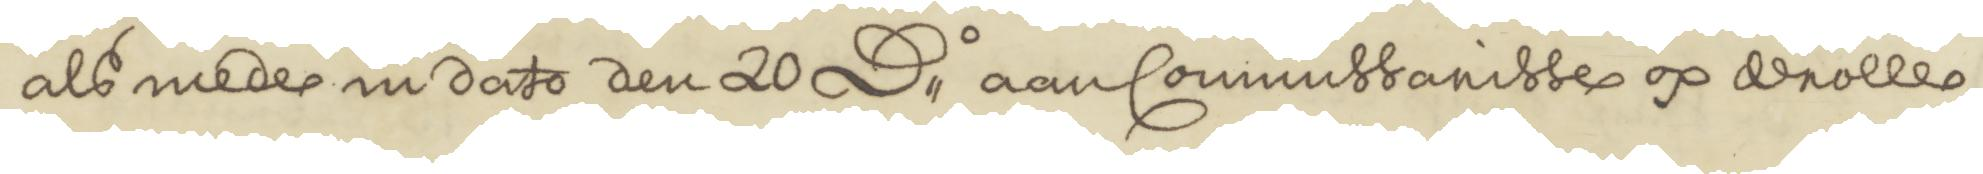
als mede in dato den 20 D„o aan Commissarisse op de rolle
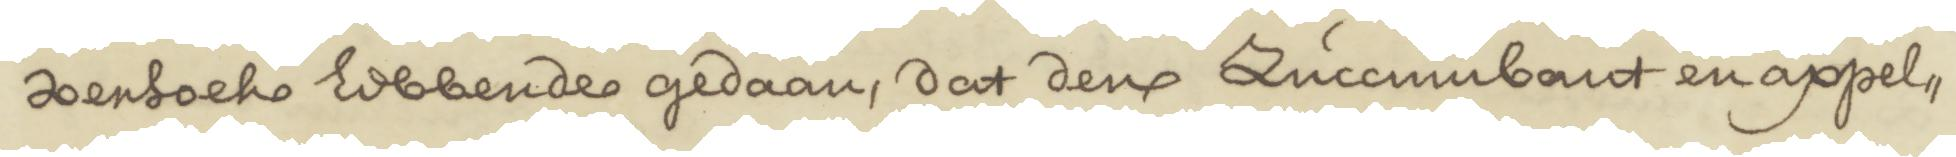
versoek hebbende gedaan, dat den Zuccumbant en appel„
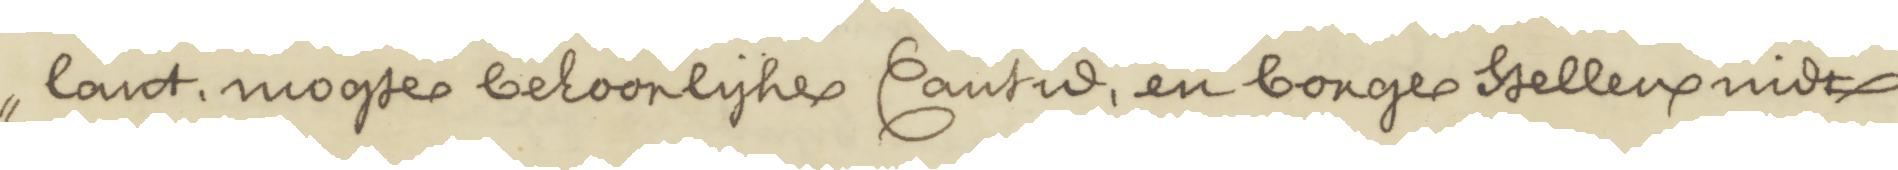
„lant, mogte behoorlijke Cautie, en borge stellen niet
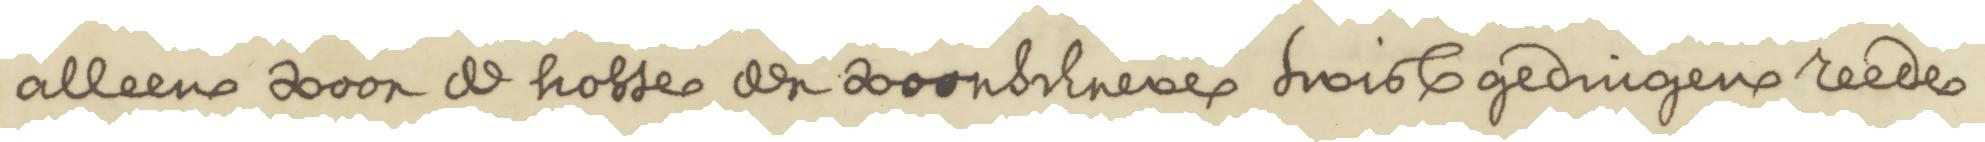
alleen voor de koste der voorschreve twist gedingen reede
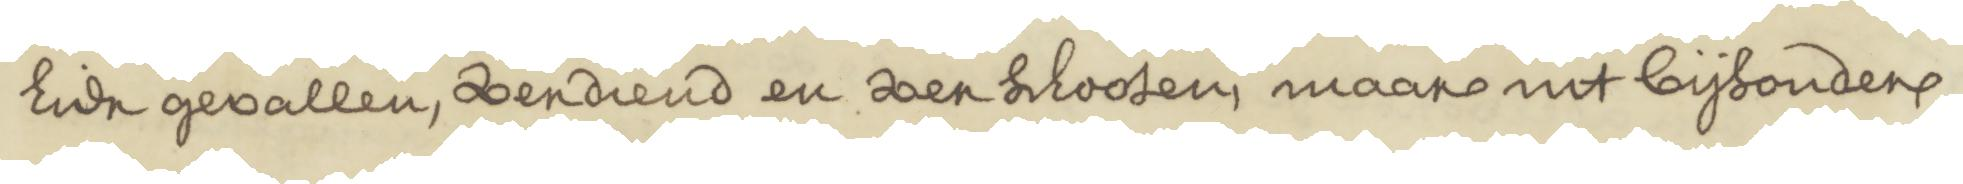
hier gevallen, verdiend en verschooten, maar int bijsonder
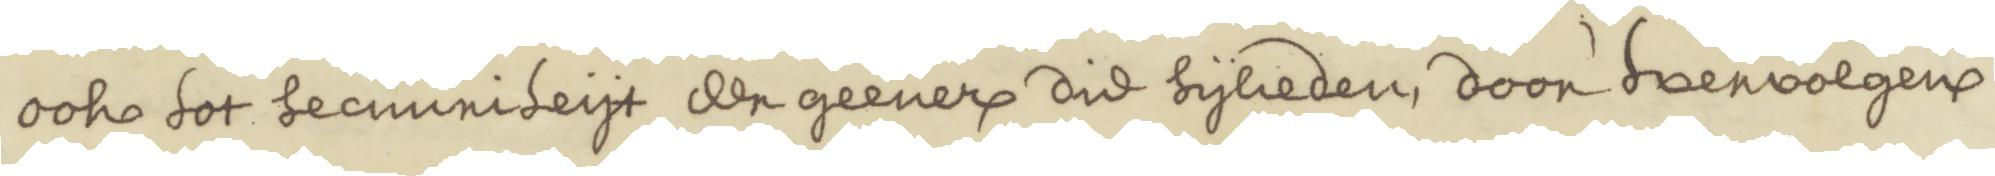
ook tot secuuriteijt der geener die sijlieden, door 'tvervolgen
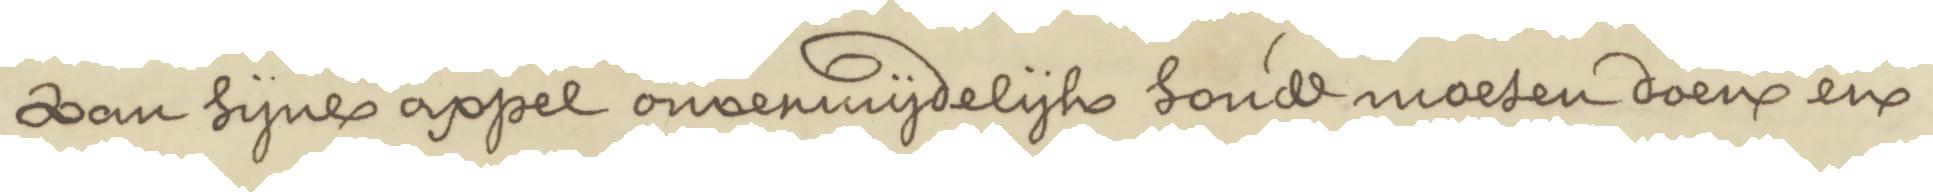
van sijne appel onvermijdelijk soude moeten doen en
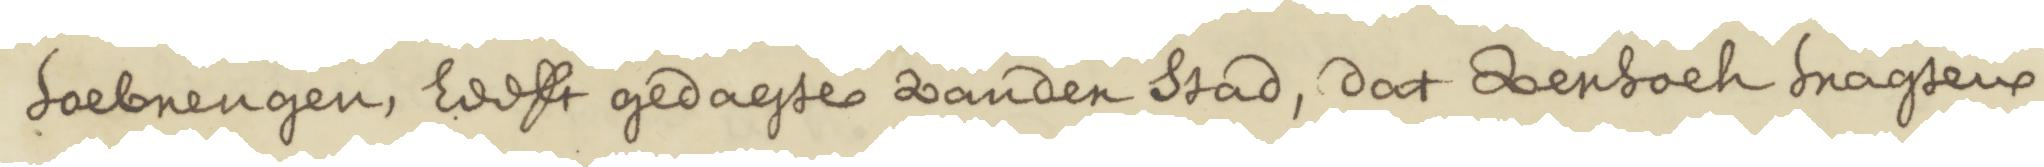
toebrengen, heeft gedagte vander stad, dat versoek tragten
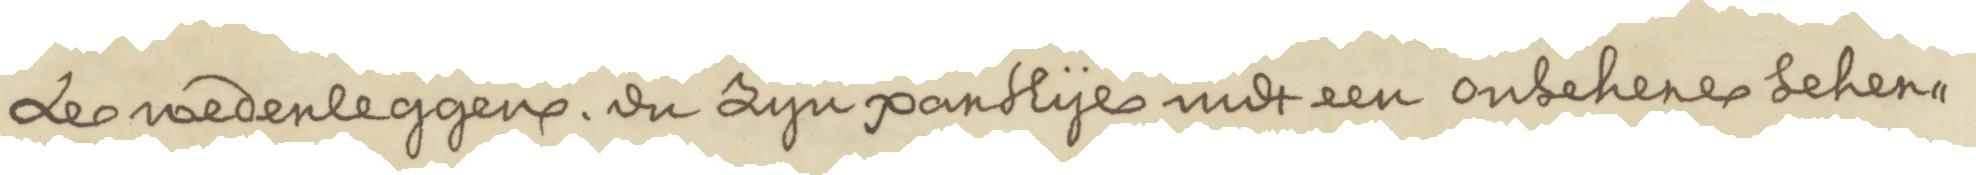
te wederleggen, en zijn parthije met een onsekere seker„
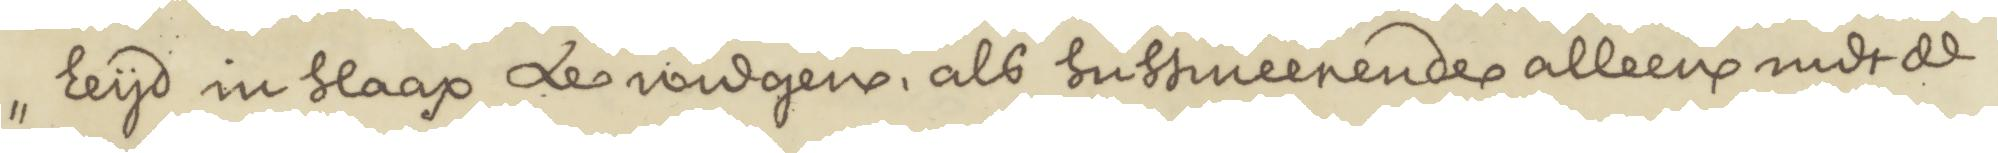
„heijd in slaap te wiegen, als sustineerende alleen met de
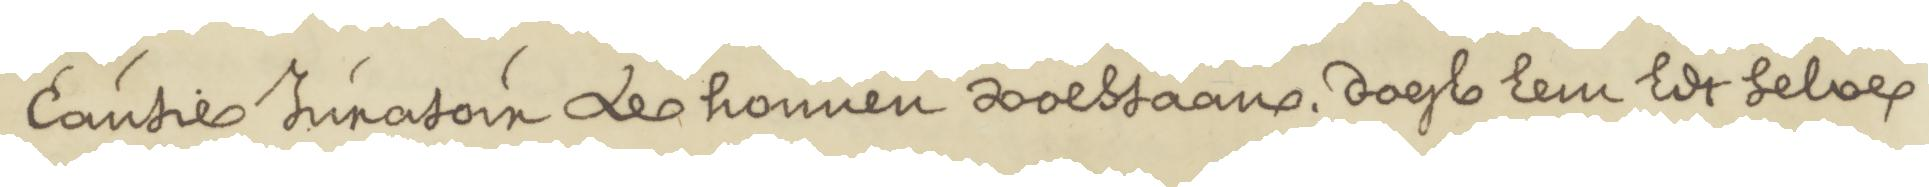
Cautie Iuratoir te konnen volstaan, dogh hem het selve
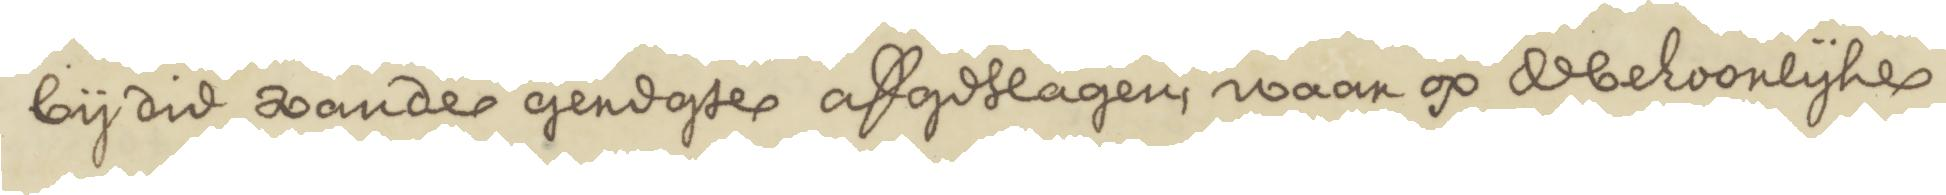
bij die vande geregte afgeslagen waar op de behoorlijke
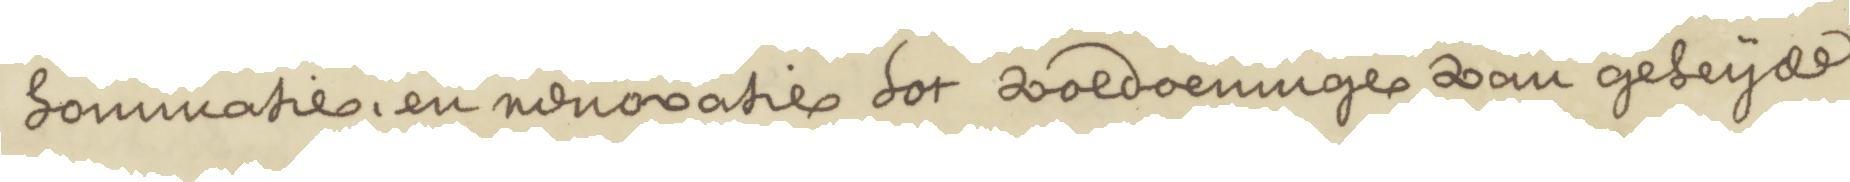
sommatie, en renovatie tot voldoeninge van geseijde
